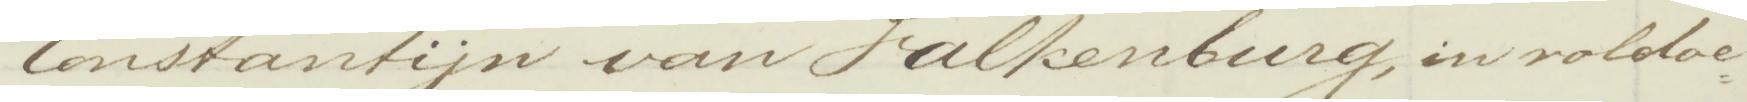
Constantijn van Valkenburg, in voldoe=
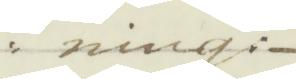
„ning:
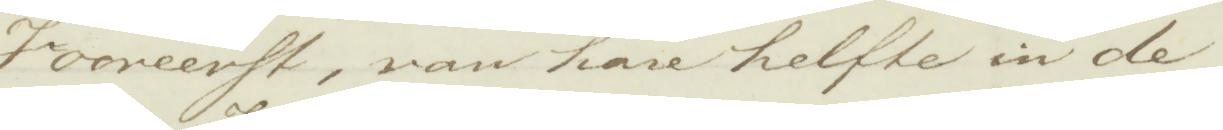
Vooreerst, van hare helfte in de
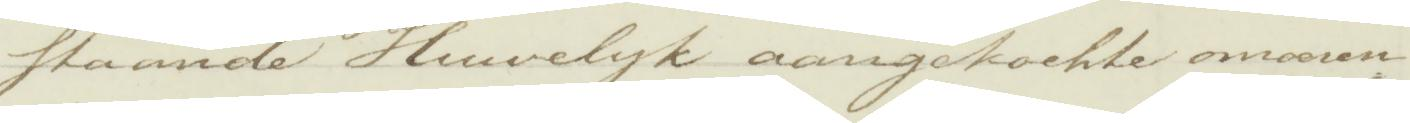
staande Huwelyk aangekochte onroeren„
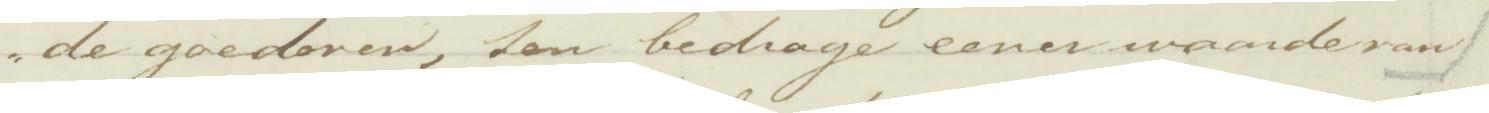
„de goederen, ten bedrage eener waarde van]
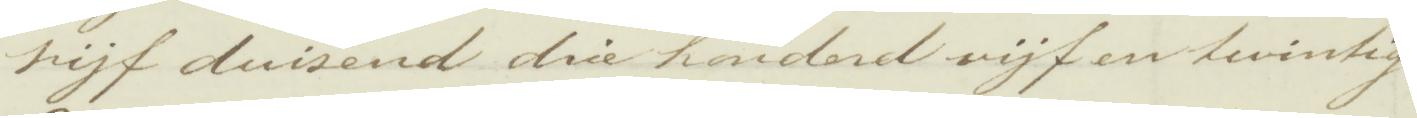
vijf duizend drie honderd vijf en twintig
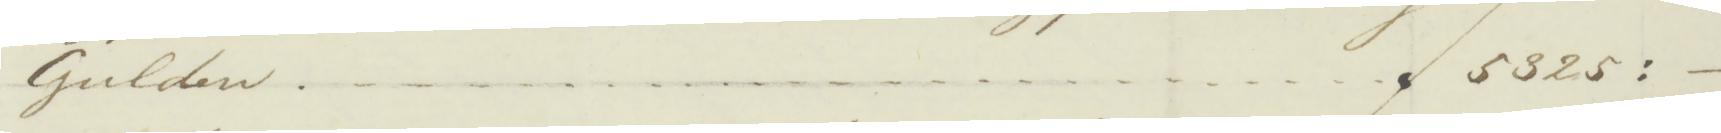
Gulden . . . . . . . . . . . . . . . . . . . . . . . . ƒ5325 : —
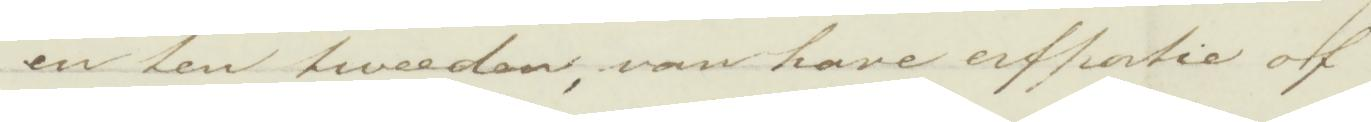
en ten tweeden, van hare erfportie of
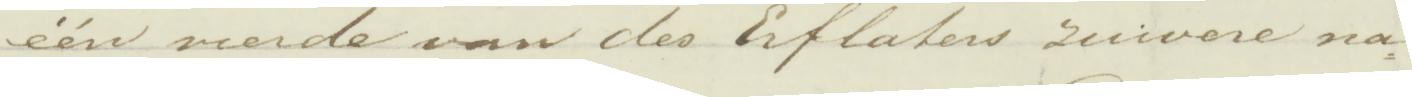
een vierde van des Erflaters zuivere na=
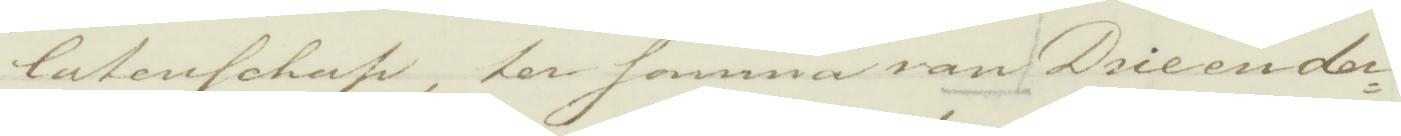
latenschap, ter somma van Drie ender=
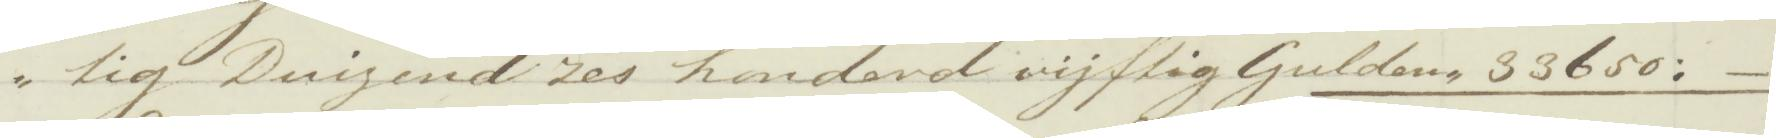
„ tig Duizend zes honderd vijftig Gulden„ 33650: —
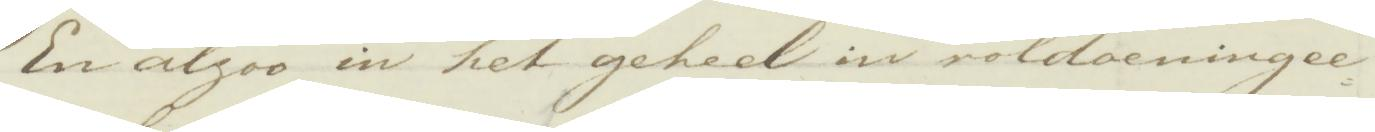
En alzoo in het geheel in voldoening ee=
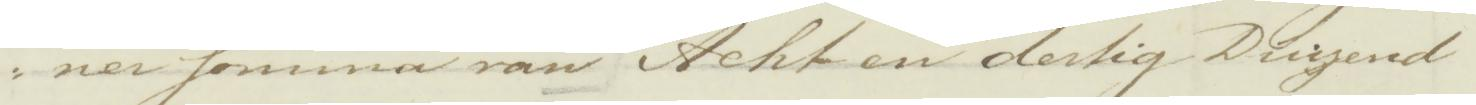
„ ner somma van Acht en dertig Duizend
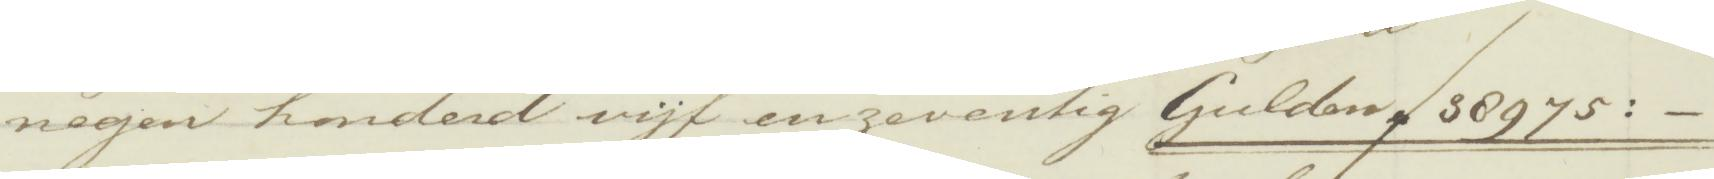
negen honderd vijf en zeventig Gulden ƒ 38975: —
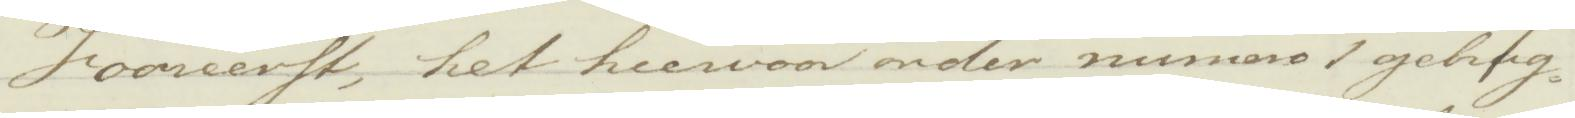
Vooreerst, het hiervoor onder numero 1 gebrag„
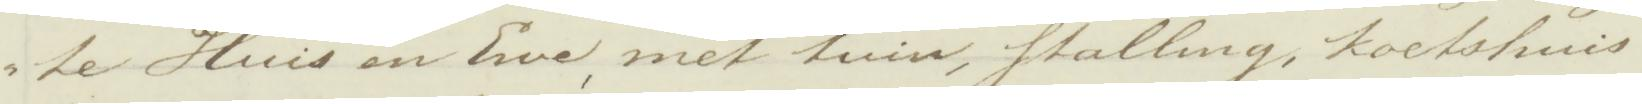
„te Huis en Erve met tuin, stalling, koetshuis
